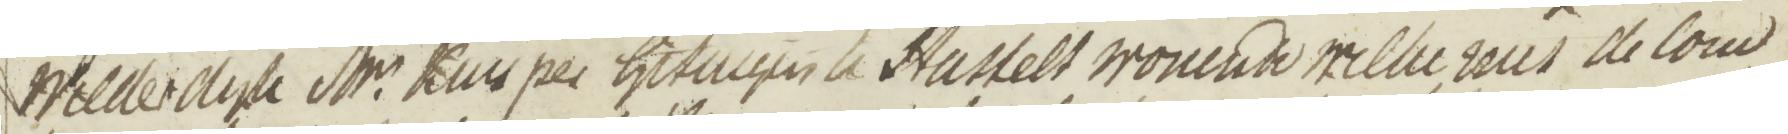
Wilderdyk M:r. Kuyper Getuigen te Hasselt wonende welke met de Com
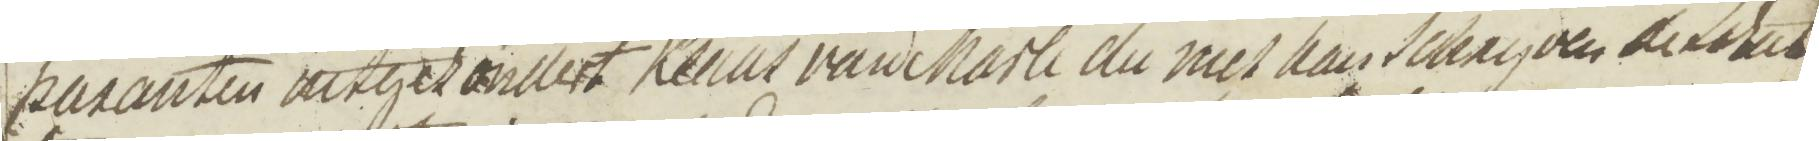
paranten uitgezondert Klaas van Mark die niet kan schryven de schat
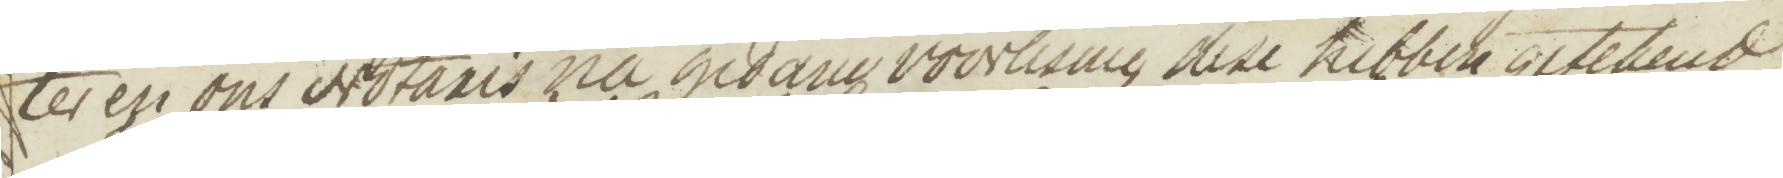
ter en ons Notaris na gedane voorlezing deze hebben getekend
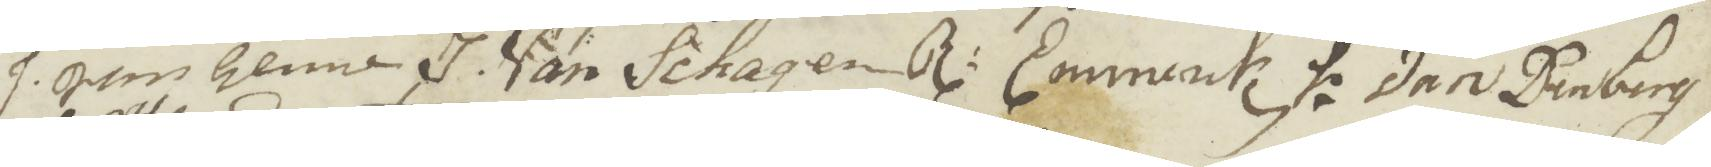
J:van Geune I. Van Schagen R: Commink k van Den berg
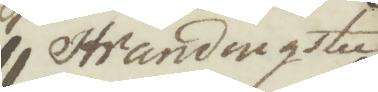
Hvandingstee
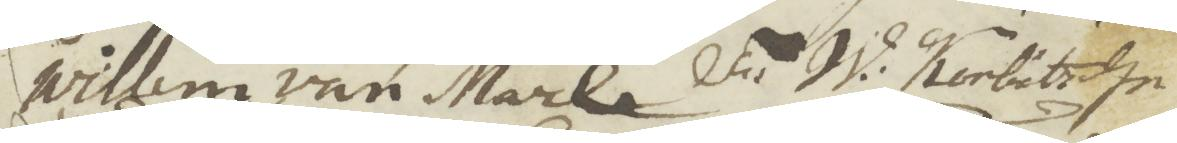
willem van Marle F: W: Korbitz Zn
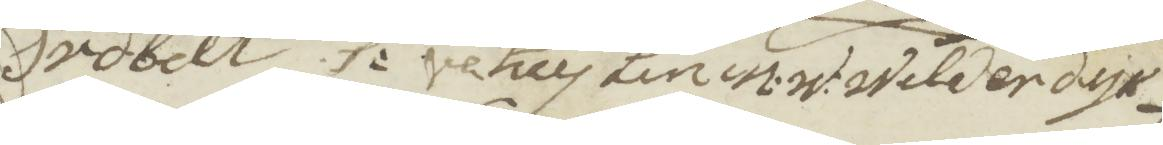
Ivdbelt s:verheysen M.W:Wilderdijk
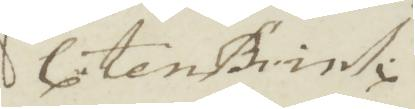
C: ten Brink
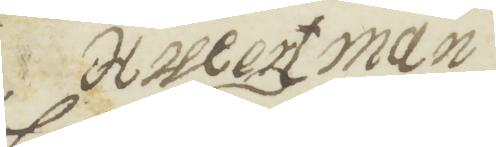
H HEertman
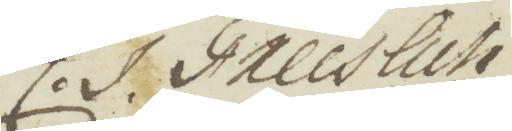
C: J. Freitlich
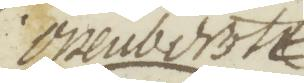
Openbarntr
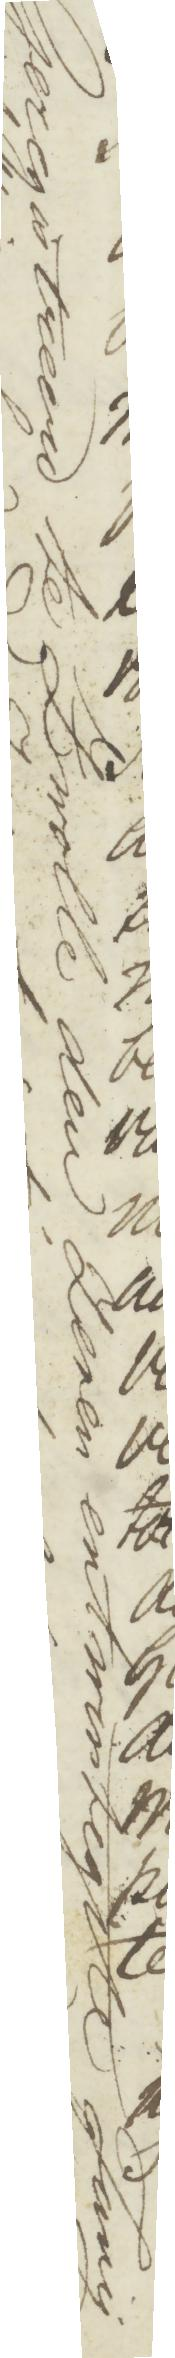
Geregistreerd te Zwolle den zeven en twintigste junij
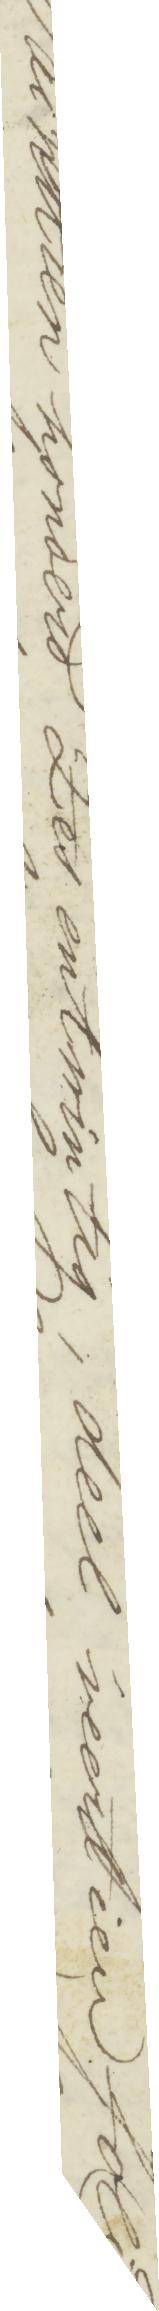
achttien honderd Zes entwintig, deel veertien folio
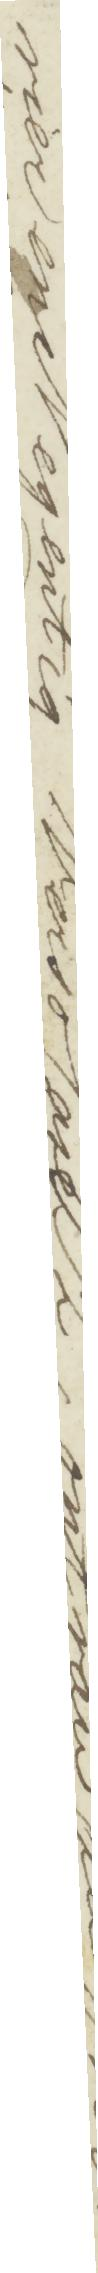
vier en Negentig Verso Cas D 2, ontvangen voor
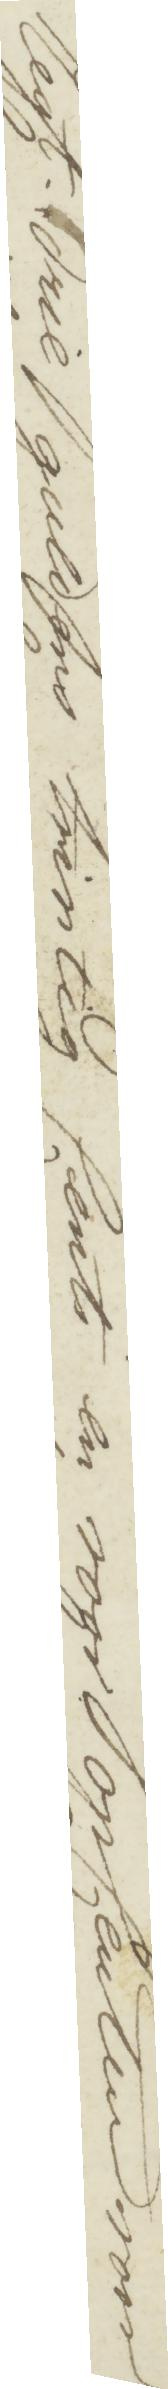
Regt. drie guldens twintig Cents en voor op Centen voor
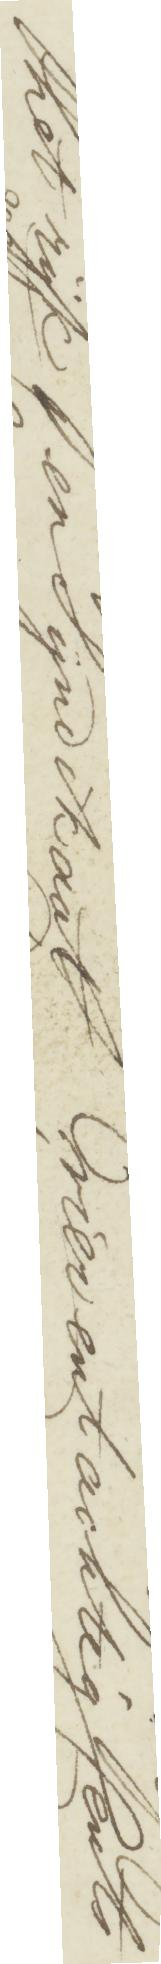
het rijk en sijndikaat vier en tachtig Cents
